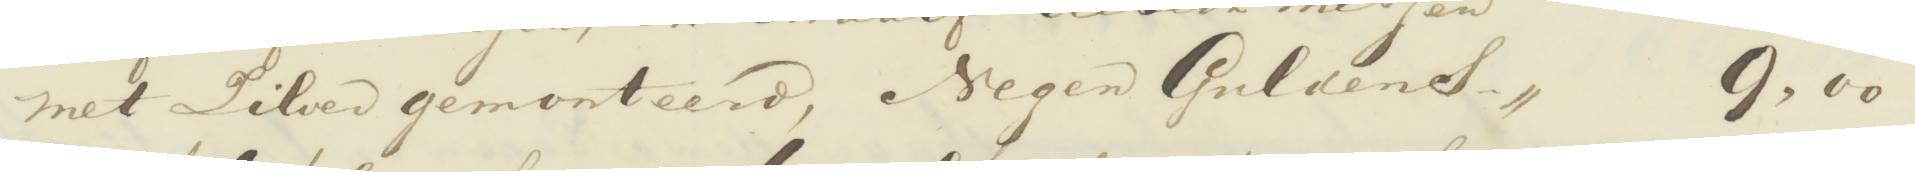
met zilver gemonteerd, Negen Guldens. . „ 9,00
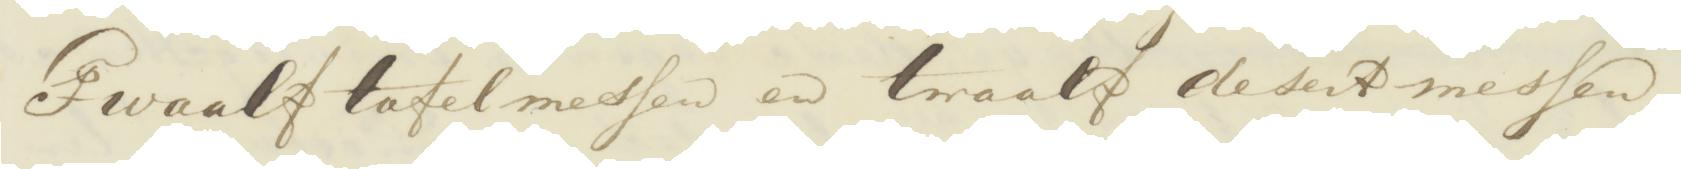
Twaalf tafelmessen en twaalf desert messen,
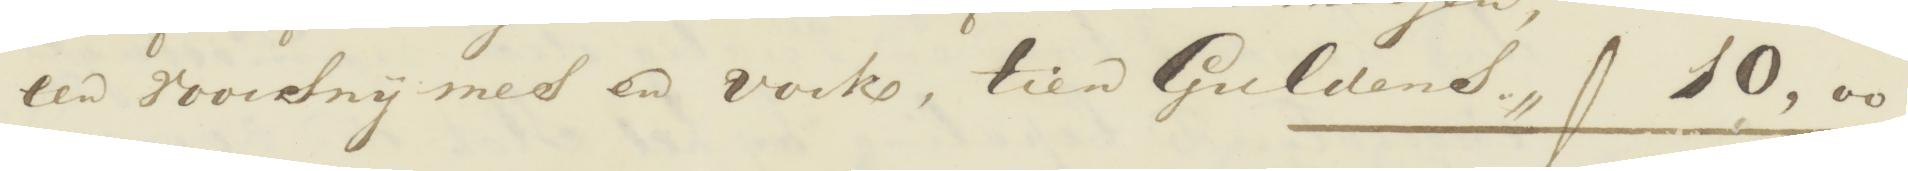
een voorsnij mes en vork, tien Guldens.„ 10,00
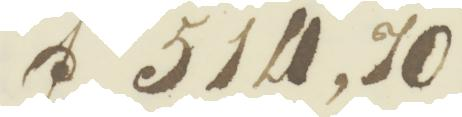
ƒ 514 70
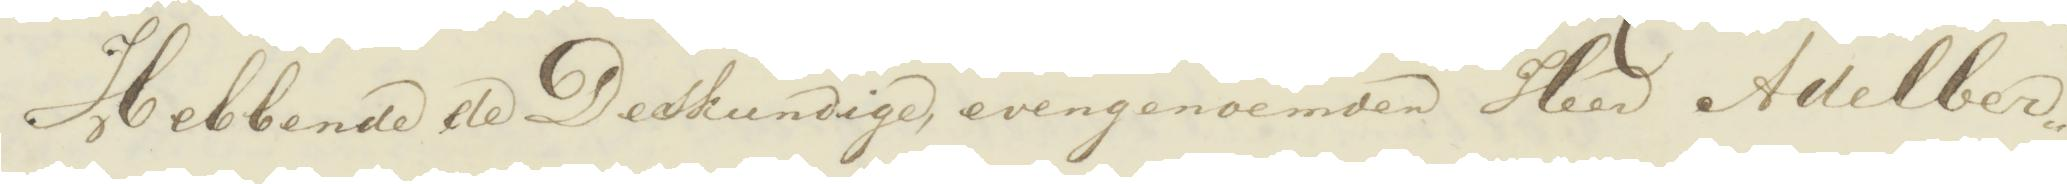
Hebbende de Deskundige, evengenoemden Heer Adelber
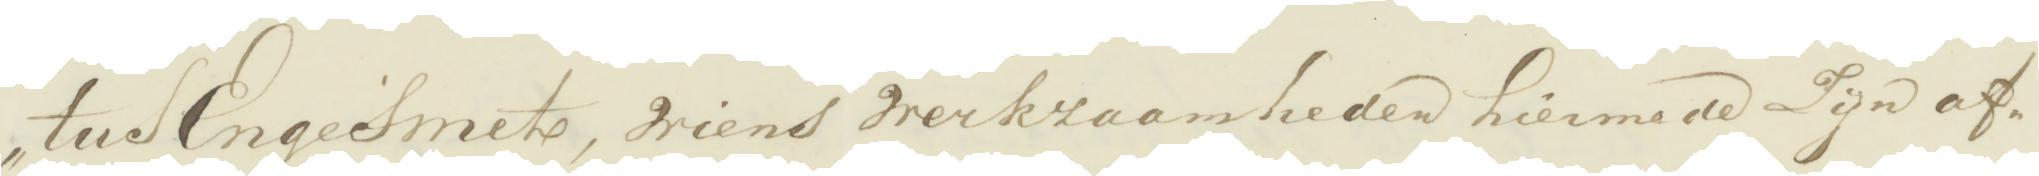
„tus Engesmet, wiens werkzaamheden hiermede zijn af„
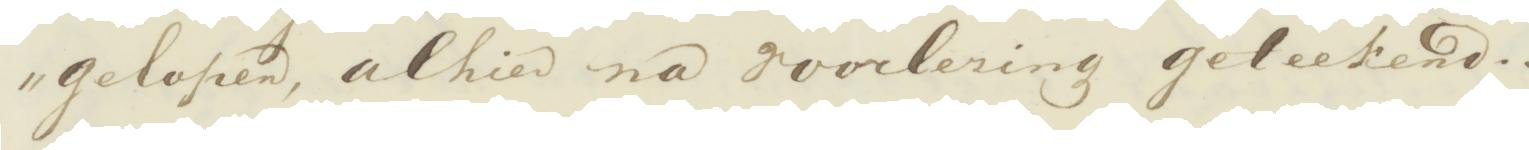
„gelopen, alhier na voorlezing geteekend.
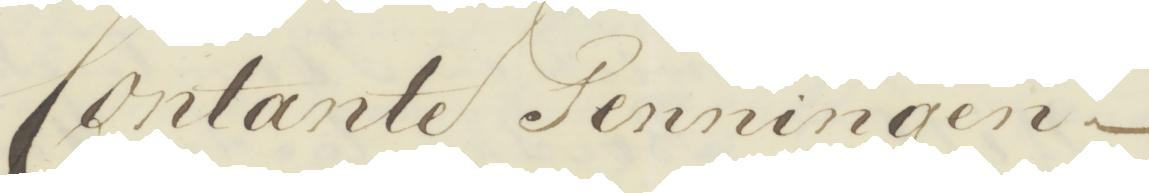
Contante Penningen —
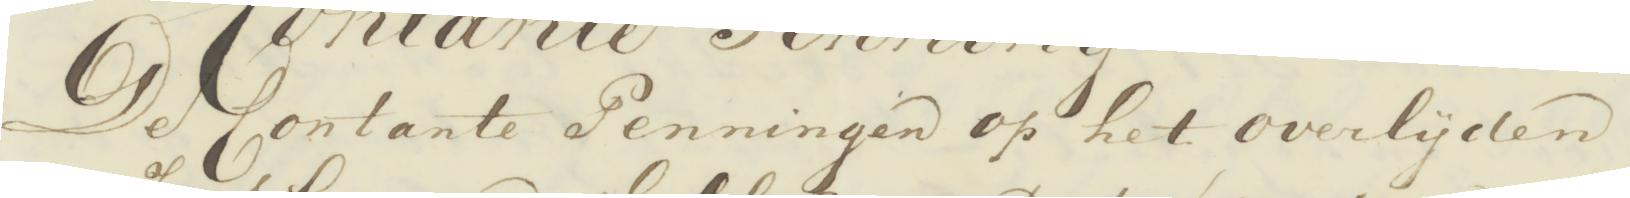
De Contante Penningen op het overlijden
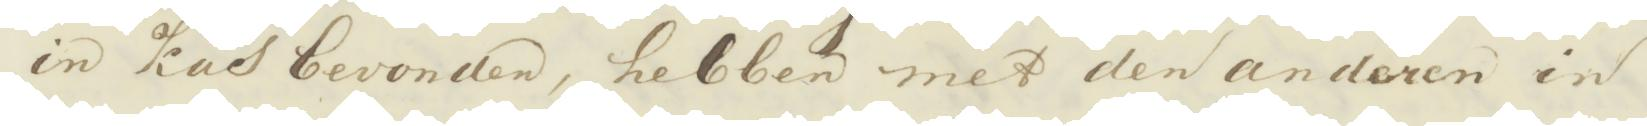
in kas bevonden, hebben met den anderen in
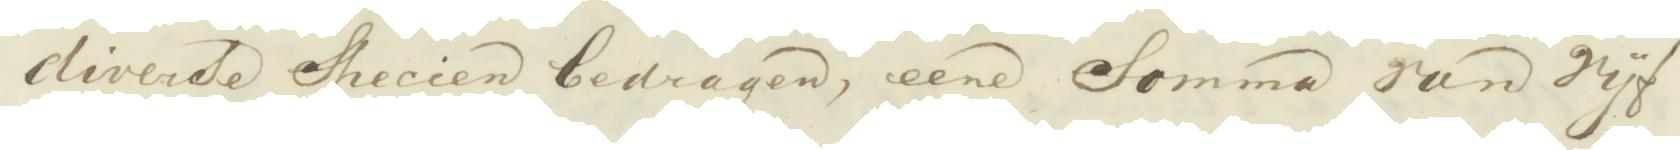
diverse specien bedragen, eene somma van vijf
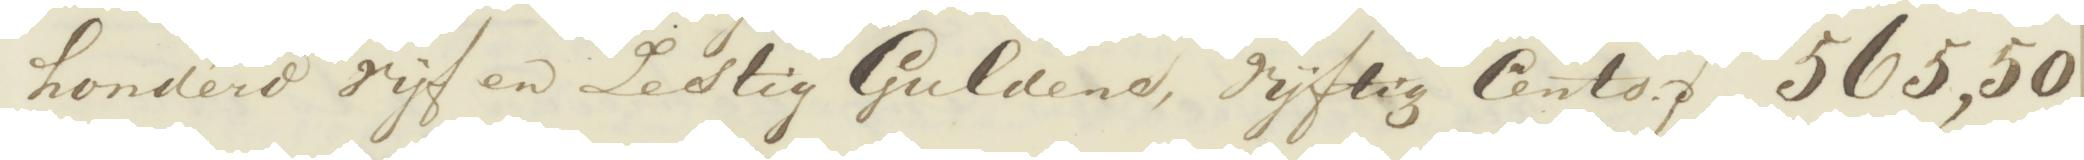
honderd vijf en zestig Guldens, vijftig Cents. ƒ 565,50
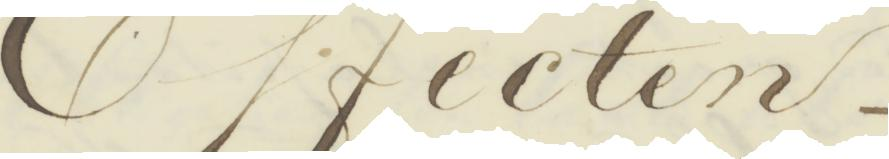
Effecten.
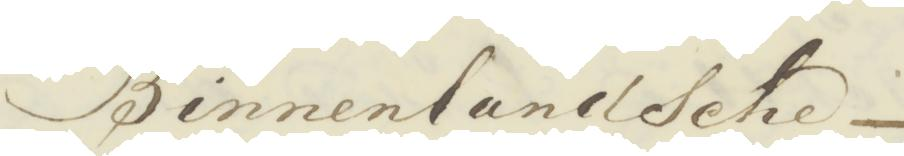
Binnenlandsche -
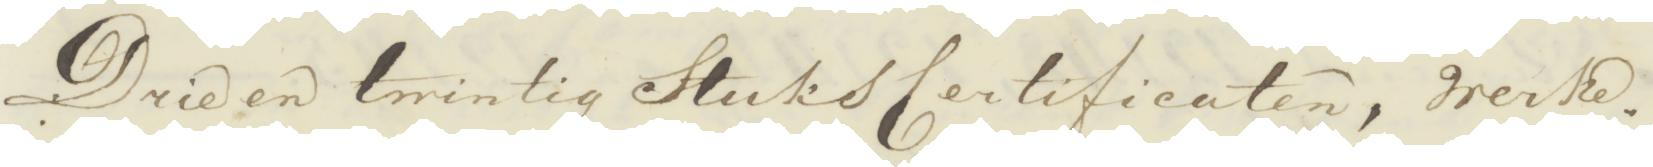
Drie en twintig stuks Certificaten, werke„
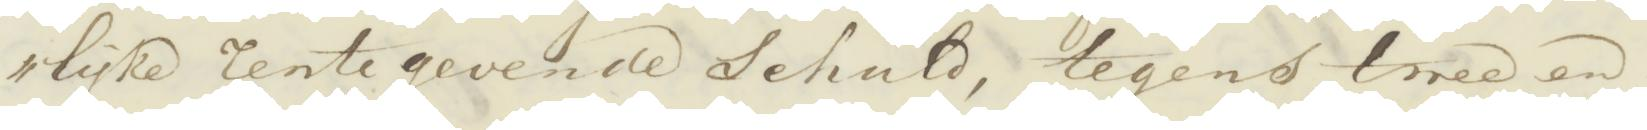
„lijke rente gevende schuld, tegens twee en
